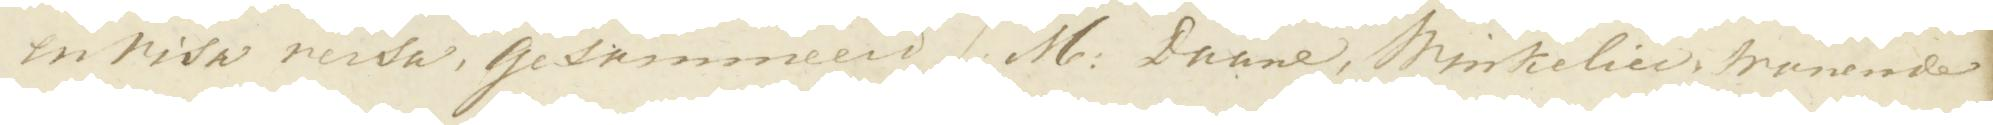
en visa versa, gesommeerd J: M: Daane, Winkelier, wonende
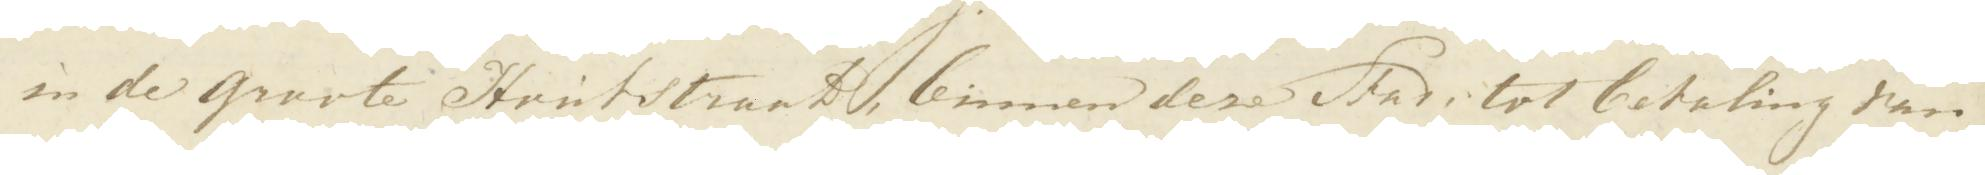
in de groote Houtstraat, binnen deze Stad, tot betaling van
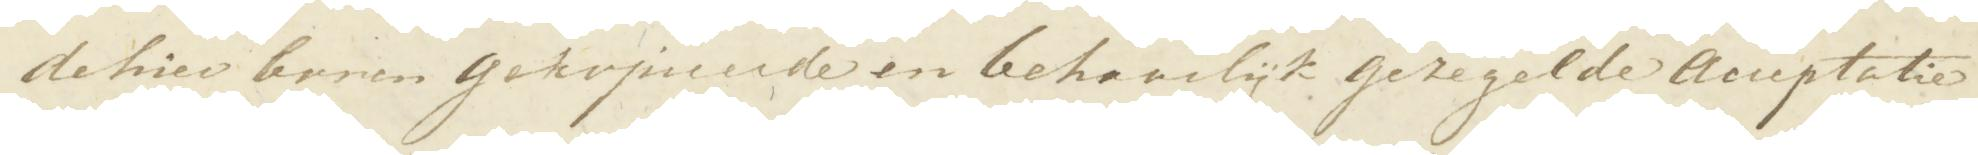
de hier boven gekopieerde en behoorlijk gezegelde Acceptatie
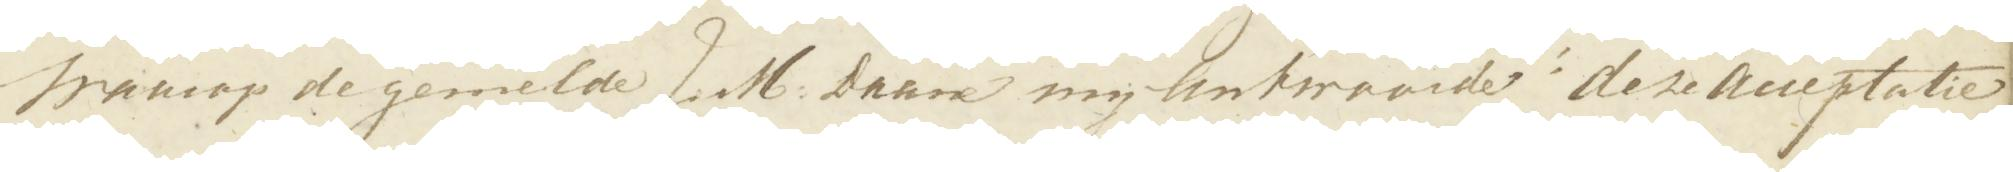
waarop de gemelde J: M: Daane mij Antwoorde "deze Acceptatie
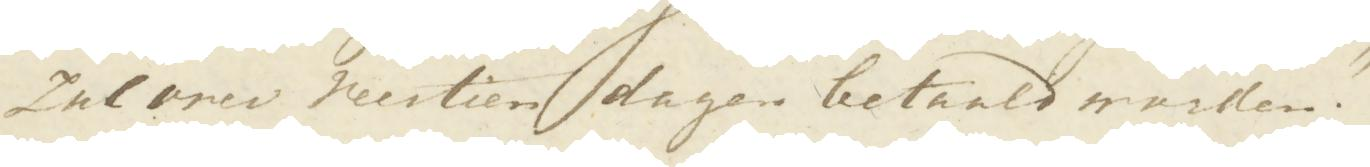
zal over veertien dagen betaald worden."
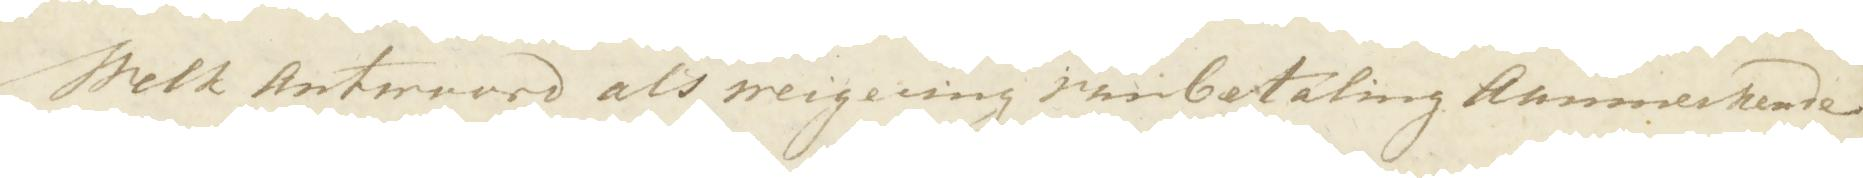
Welk Antwoord als weigering van betaling Aanmerkende
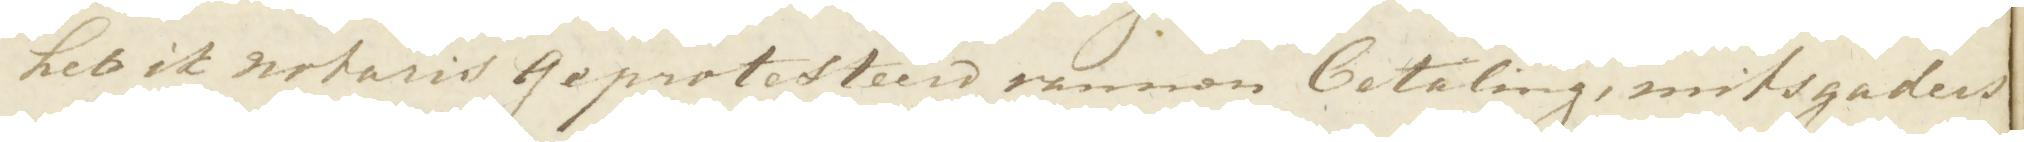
heb ik notaris geprotesteerd vannen betaling, mitsgaders
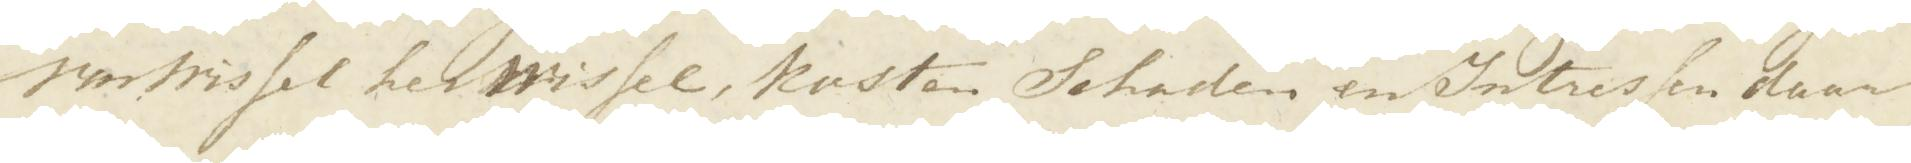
van wissel herwissel, kosten Schaden en Intressen daar
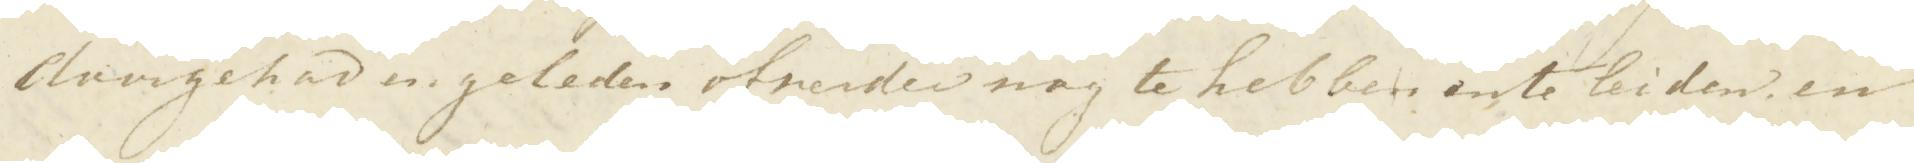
door gehad en geleden of verder nog te hebben en te leiden, en
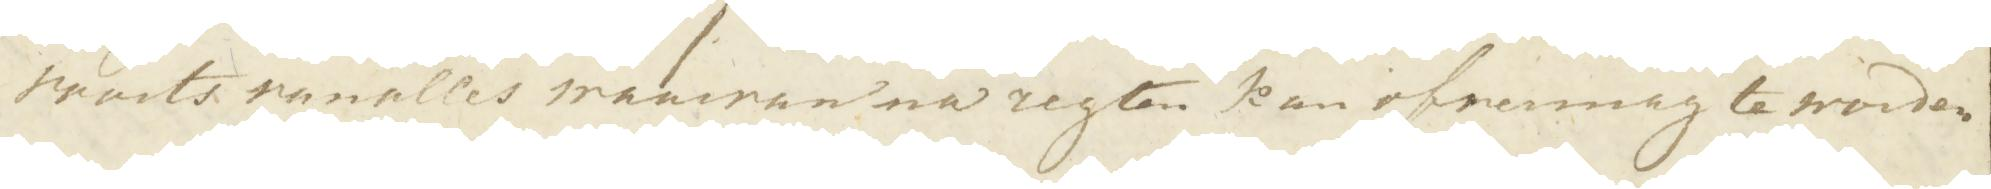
voorts van alles waarvan na regten kan of vermag te worden
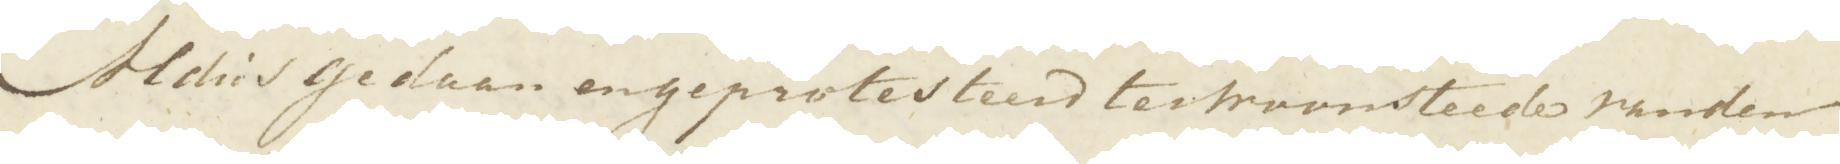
Aldus gedaan en geprotesteerd ter woonsteede van den
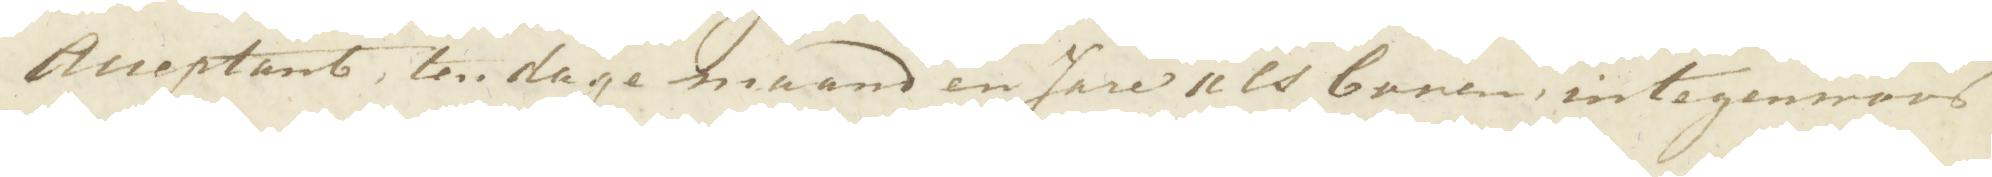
Acceptant, ten dage maand en Jare als boven, in tegenwoor
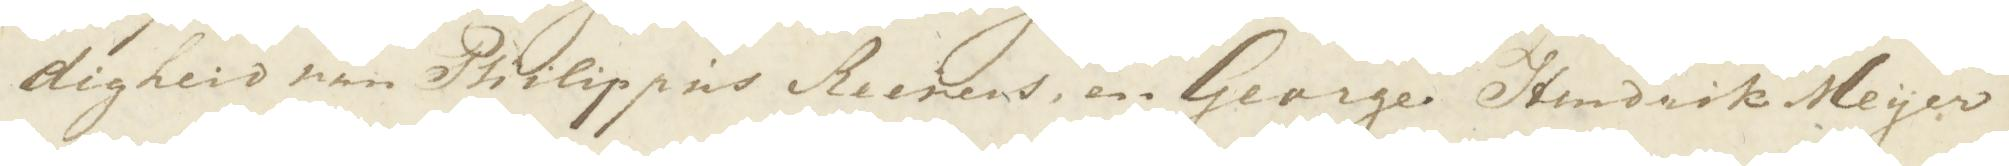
digheid van Philippus Reevers, en George Hendrik Meijer
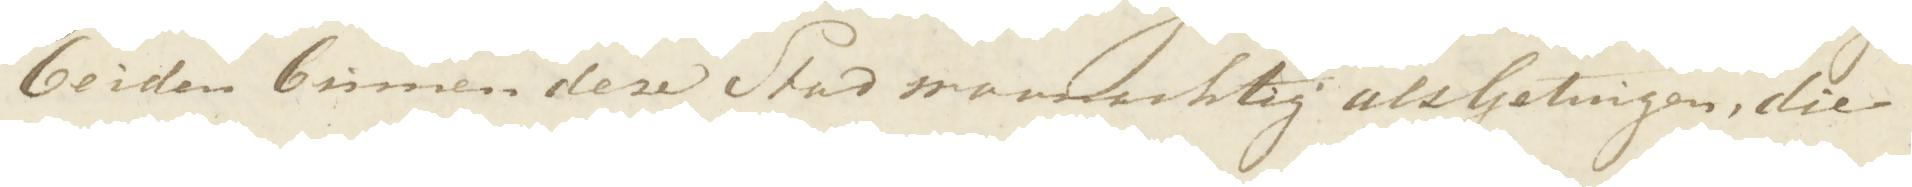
beiden binnen deze Stad woonachtig als Getuigen, die
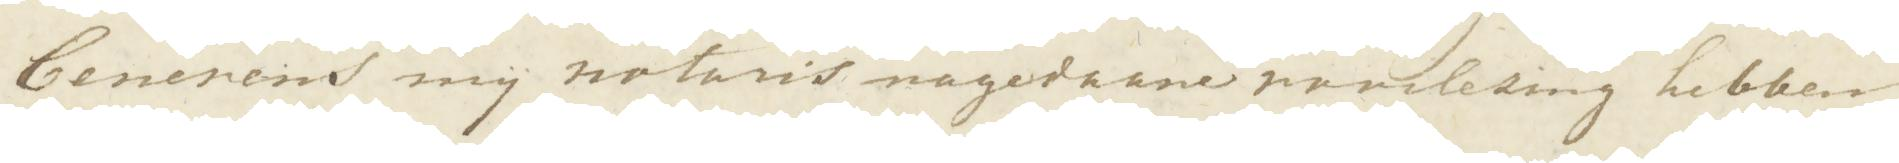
benevens mij notaris nagedaane voorlezing hebben
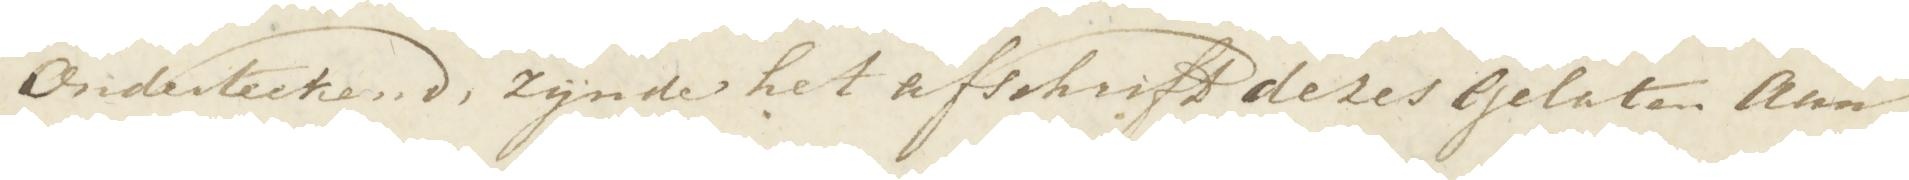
Onderteekend, zijnde het afschrift dezes gelaten Aan
